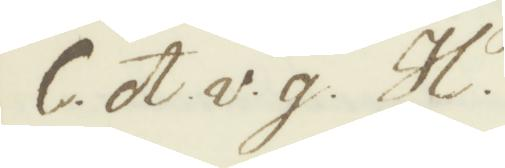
C. A. v. g. H.
